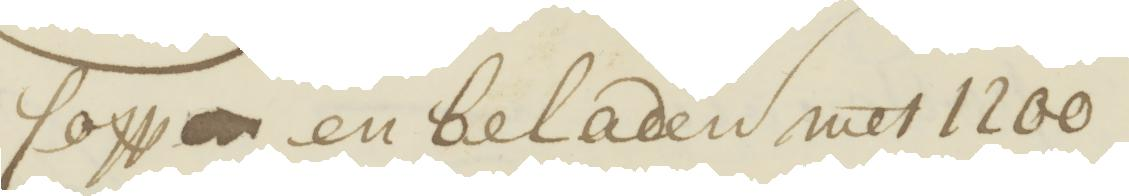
Coppen en beladen met 1200
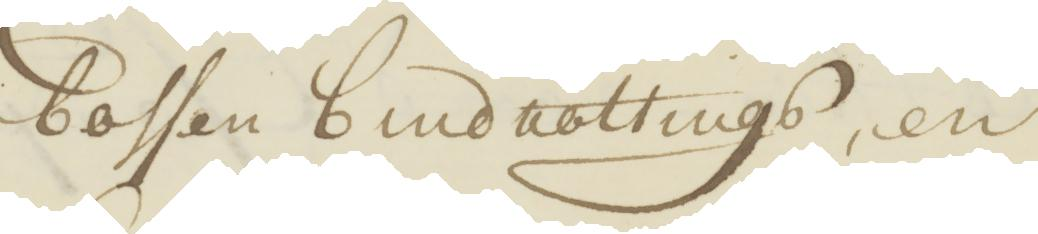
bossen bindrottings, en
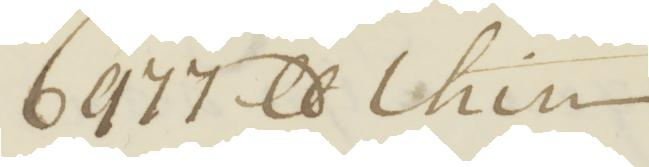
6977 lb thin
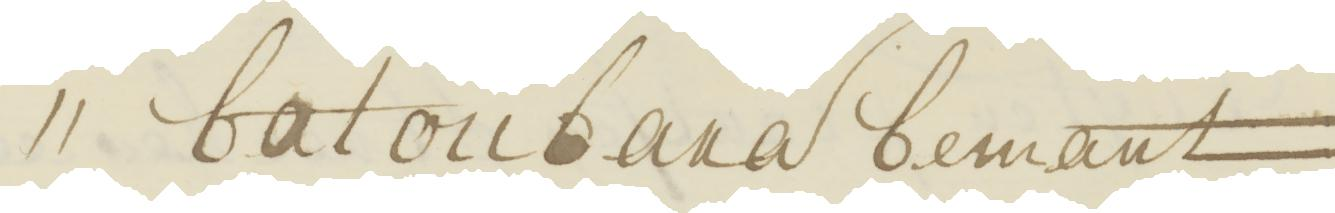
1 —:' „ batoubara bemant
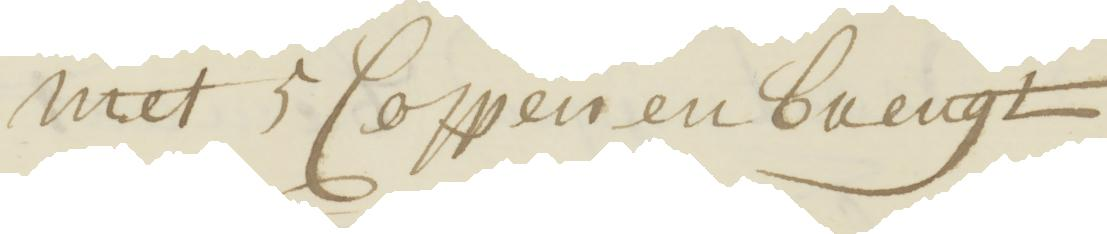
met 5 Coppen en brengt
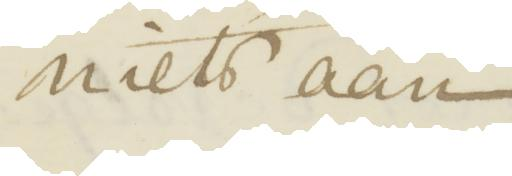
niets aan
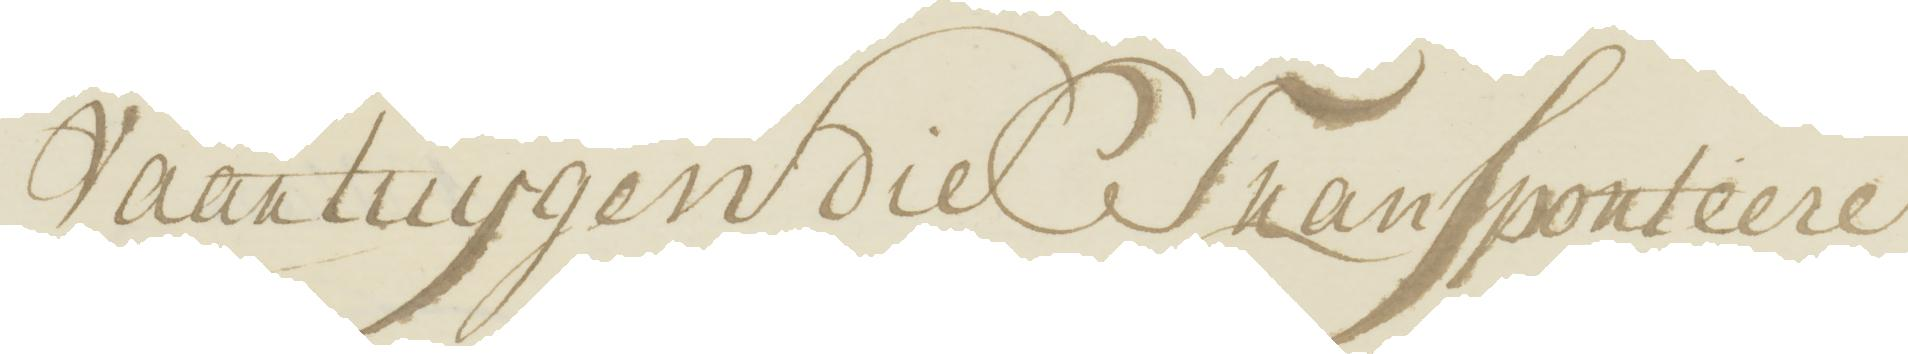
8 Vaartuijgen die Transporteere
